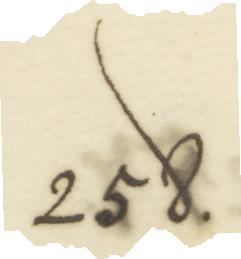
258.
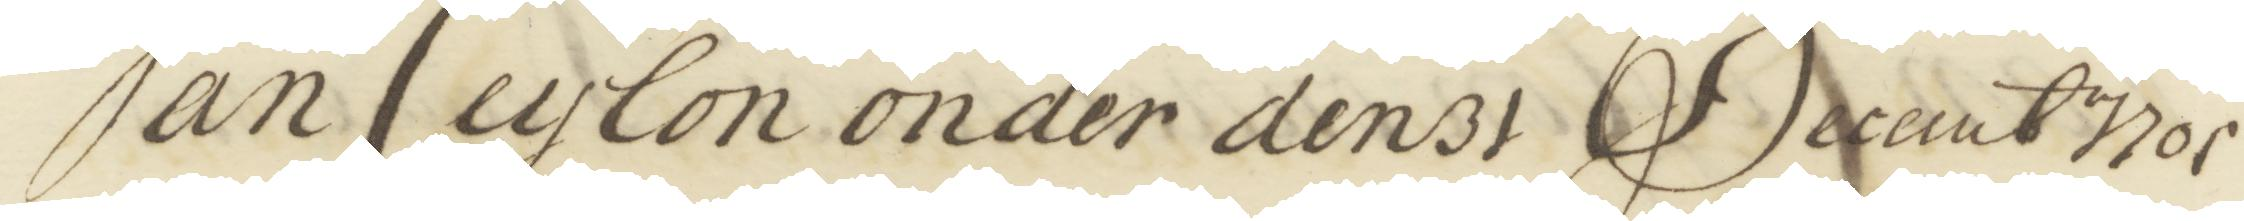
Van Ceylon onder den31 Decemb 1705
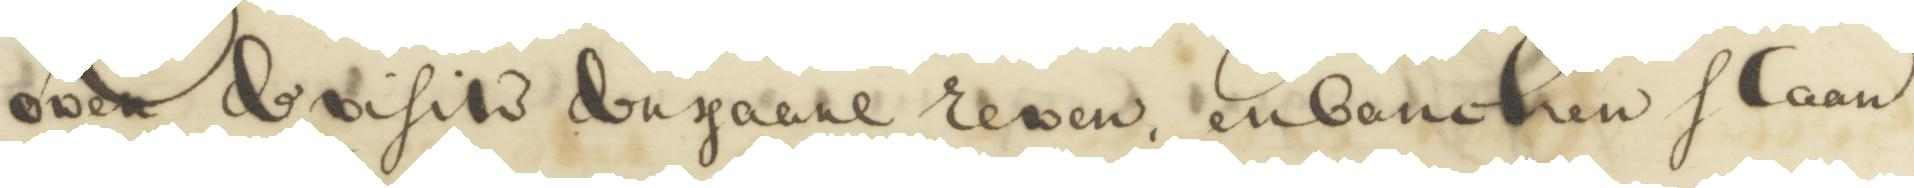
over de visite der paare reven, enbancken staan
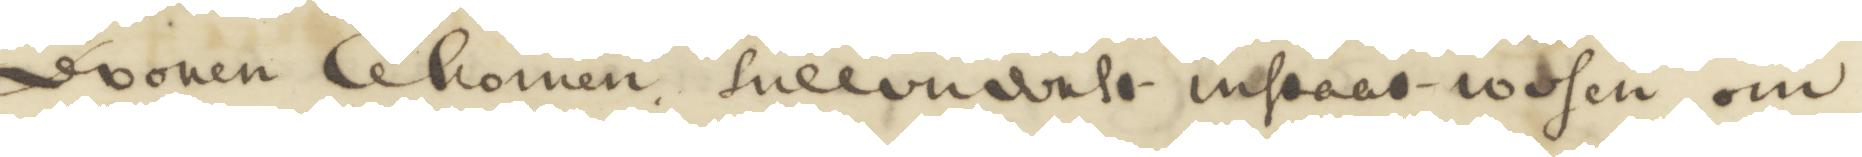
tevoren tekomen, sullen eerst instaat wesen, om
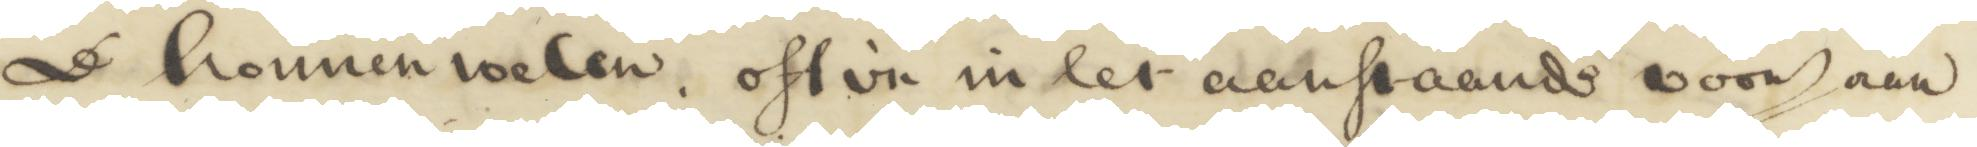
te konnen weten, oft er in het aanstaande voorjaar
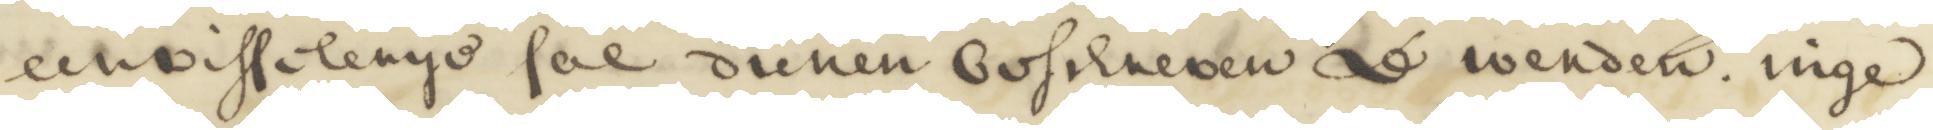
eenvisscherije sal dienen beschreven te werden. inge
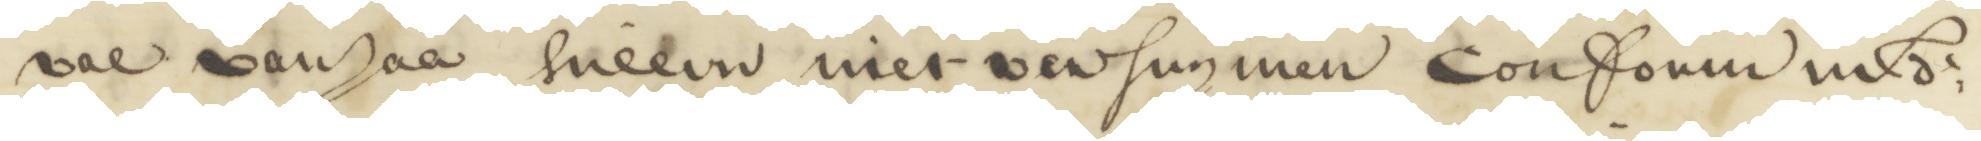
val vanjaa, sullen niet versuijmen conform uEd:
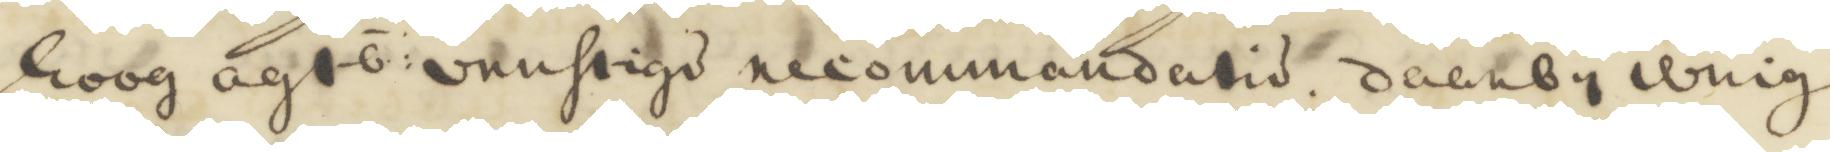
hoog agtb: ernstige recommandatie. daarbij eenig
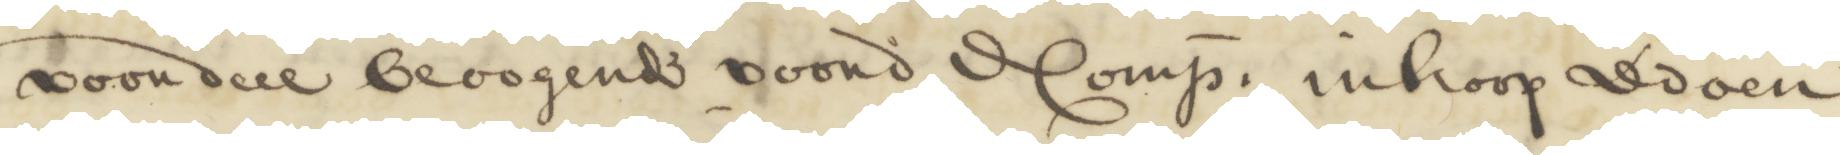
voor deel beoogende voord' EComp: inkoop te doen
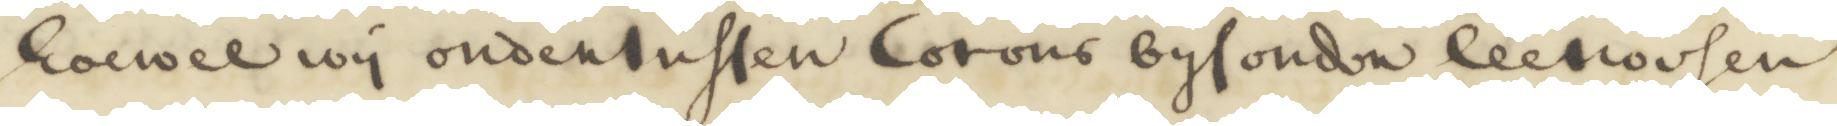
hoewel wij ondertussen tot ons bijsonder leetwesen
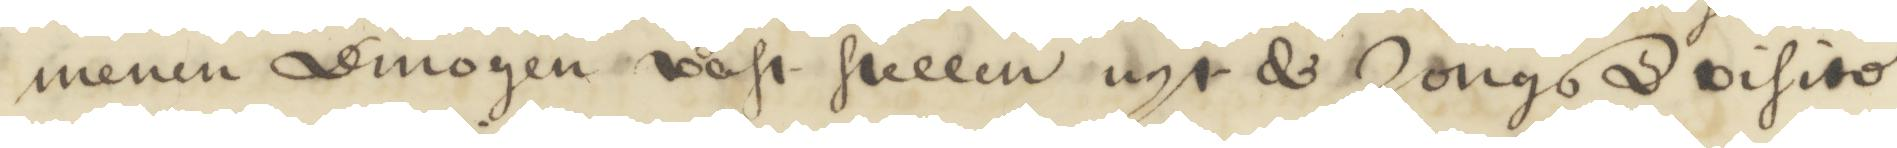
menen temogen vast stellen uyt de jongste visite
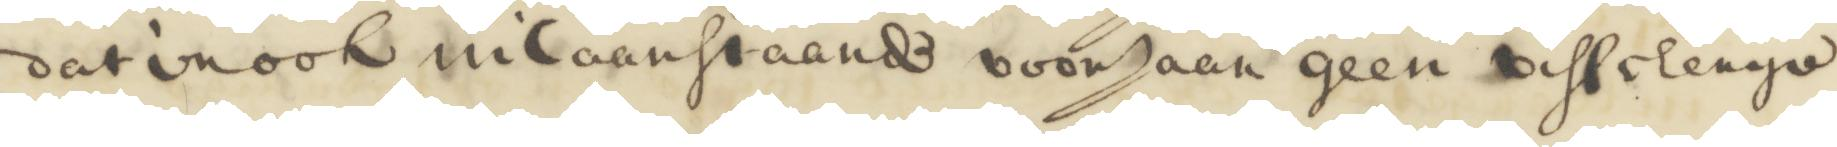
dat 'erook uit aanstaande voorjaar geen visscherye
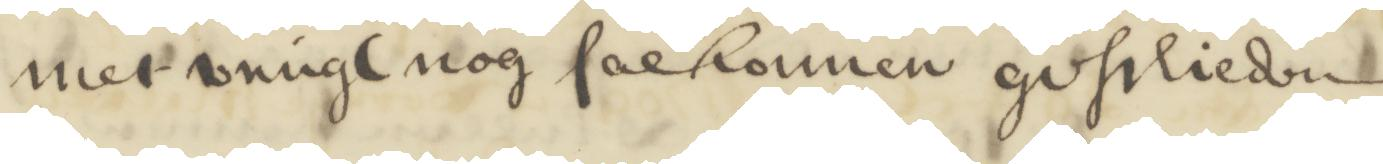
met vrugt nog salkonnen geschieden
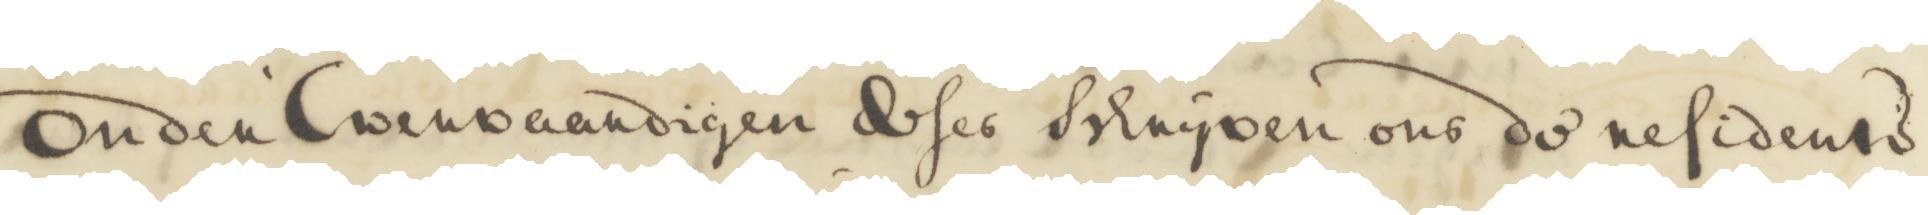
Onder 'tvervaardigen deses schrijven ons de residente
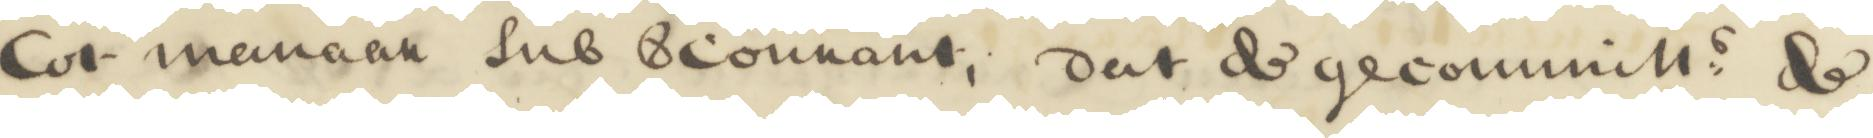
tot memaar sub 8 courant; dat de gecommitt:s de
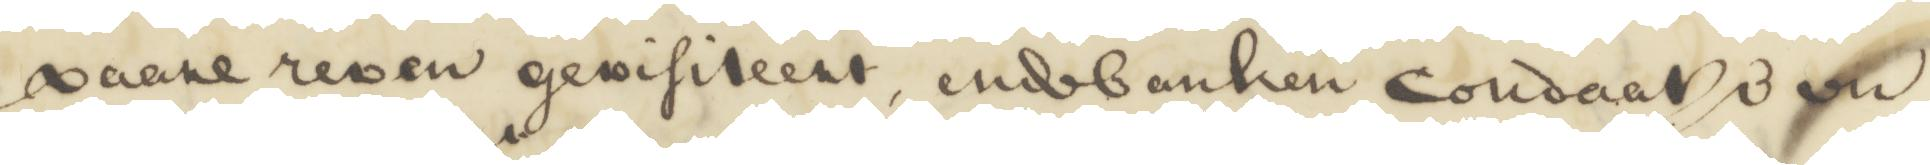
paare reven gevisiteert, endebanken condaatje en
